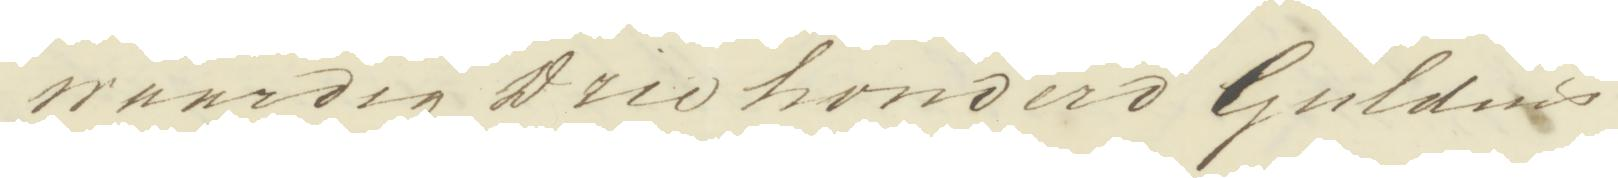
waardig Drie honderd Guldens
